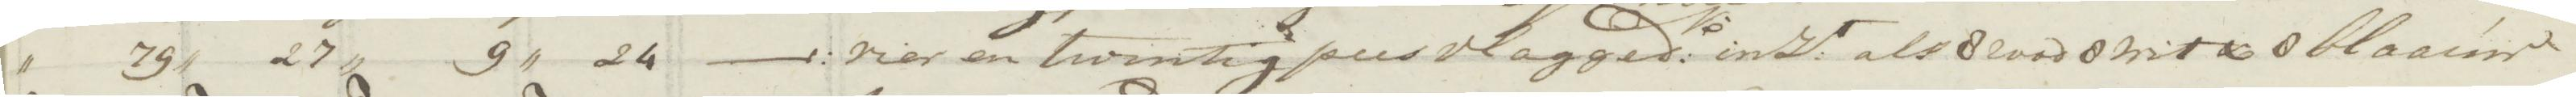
„ 79„ 27„ 9„ 24 _: vier en twintig pees vlagged:k in z:t als 8 rood 8 wit & 8 blaauw
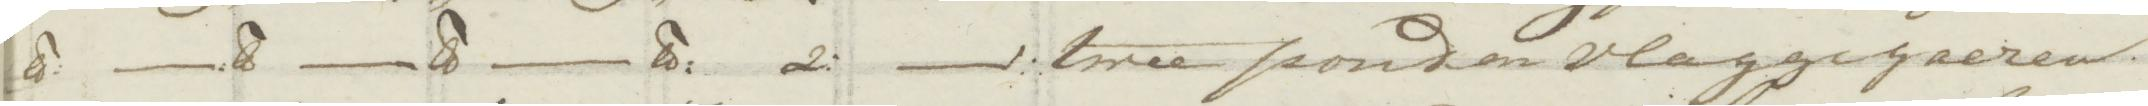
lb: —: lb — lb — lb: 2: —: twee ponden vlaggegaeren
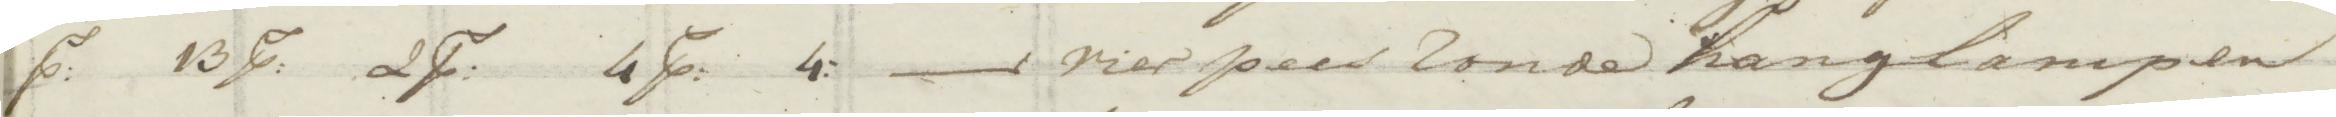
p:s 13 p:s 2 p:s 4 p:s 4: _: vier pees ronde hanglampen
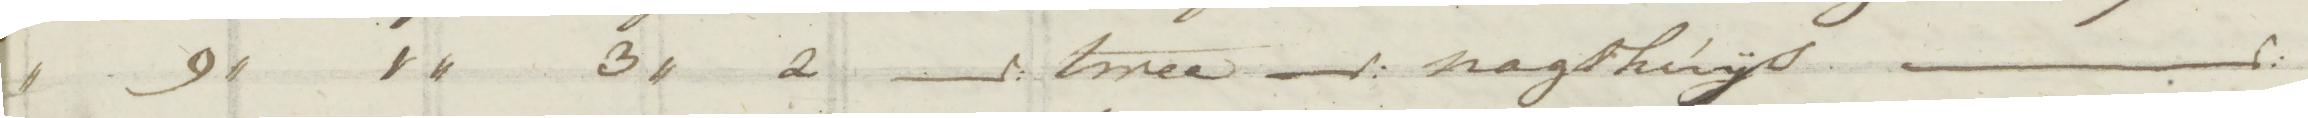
„ 9„ 1„ 3„ 2 _: twee _: nagthuijs _:
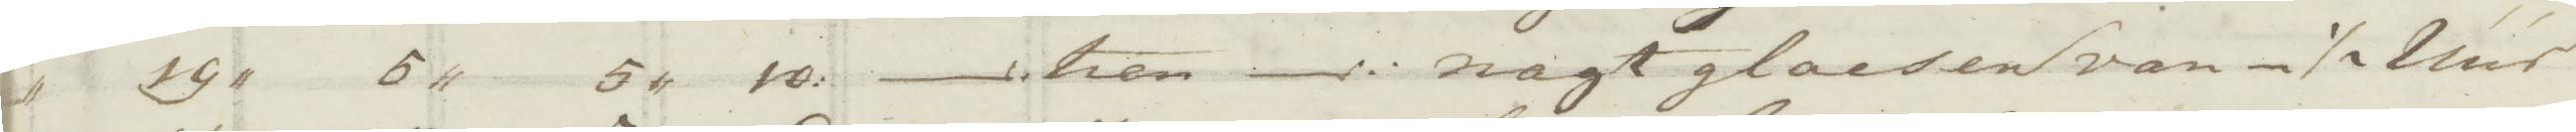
„ 19„ 5„ 5„ 10: _: tien _: nagt glaesen van — ½ uur
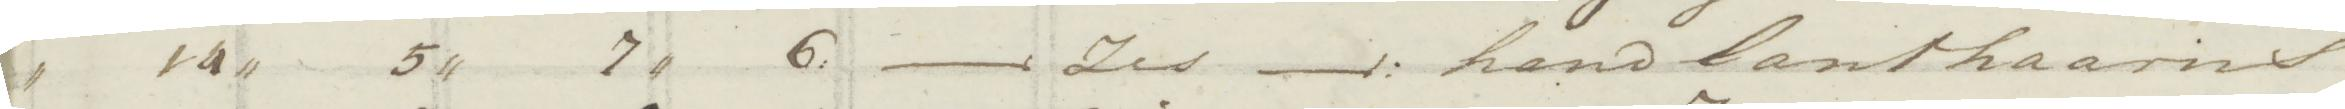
„ 14„ 5„ 7„ 6: _: zes _: hand lanthaarns
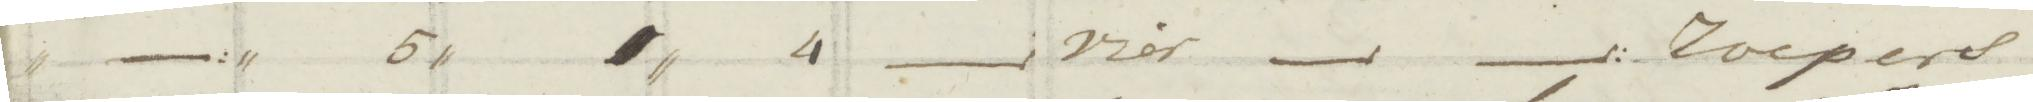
„ —:„ 5„ 1„ 4 _: vier _: _: roepers
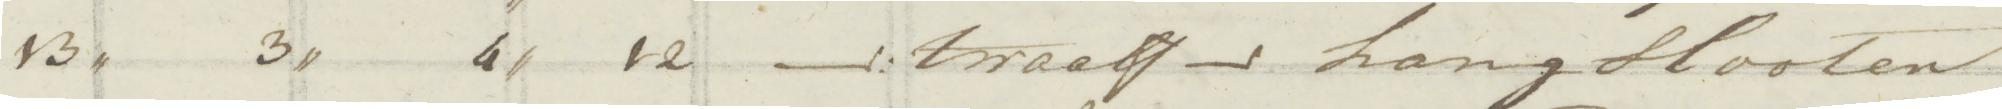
13„ 3„ 4„ 12 _: twaalf _ hangslooten
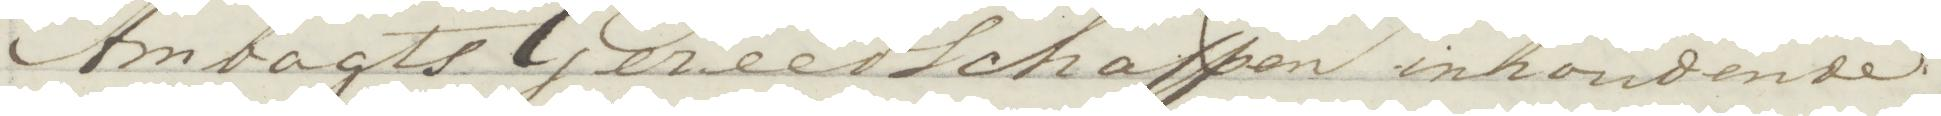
Ambagts Gereedschappen inhoudende
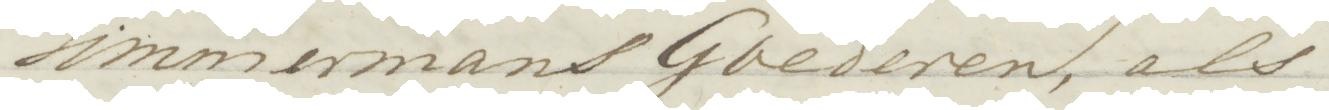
Timmermans Goederen, als
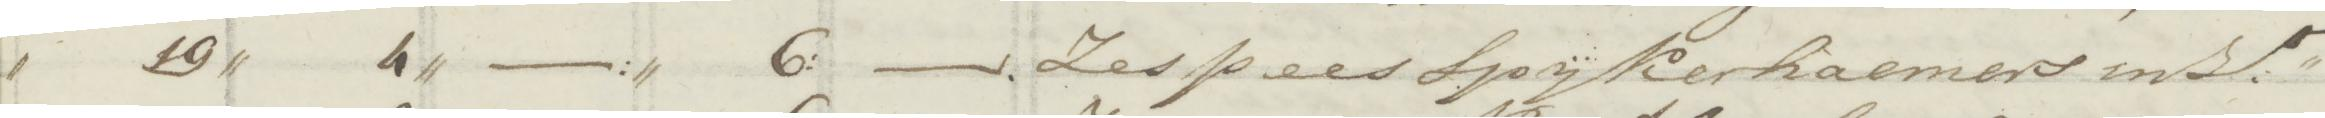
„ 19„ 4„ —:„ 6: _: zes pees spijkerhaemers inz:„t
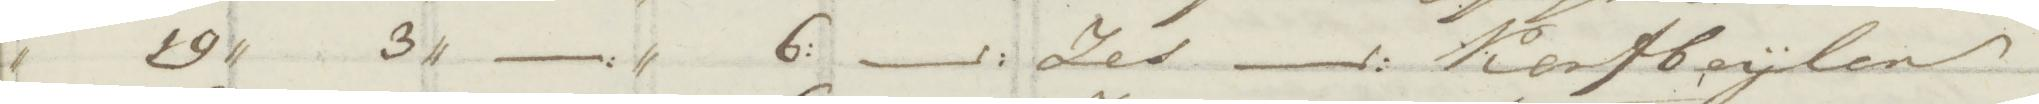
„ 19„ 3„ —: „ 6: _: zes _: Kerfbeijlen
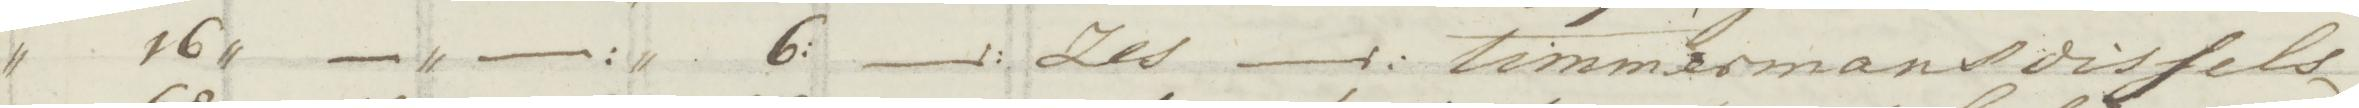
„ 16„ — „ —: „ 6: _: zes _: timmermansdissels
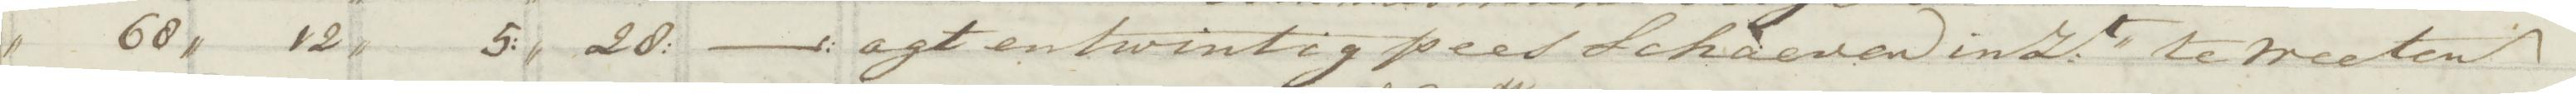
„ 68„ 12„ 5: 28: _: agt en twintig pees schaeven in z:t te weeten
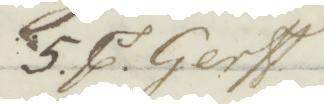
5. p.s Gerff
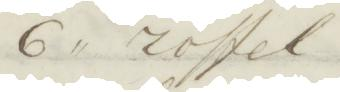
6„ roffel
